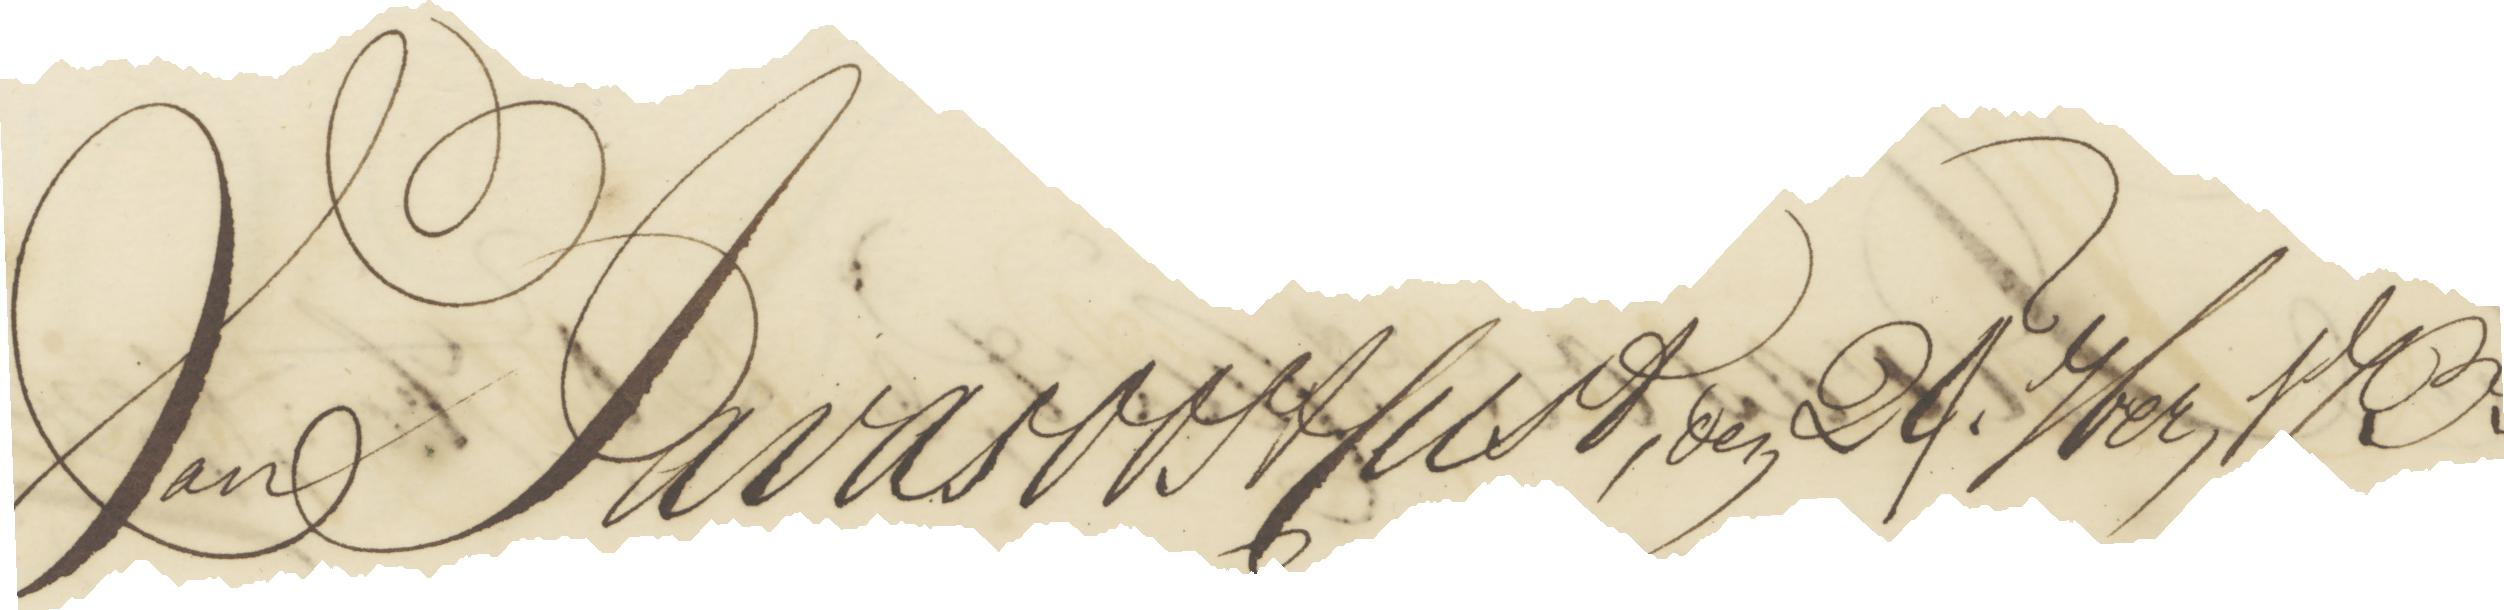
Van Javasoostcust, den 24„' 7ber 1733
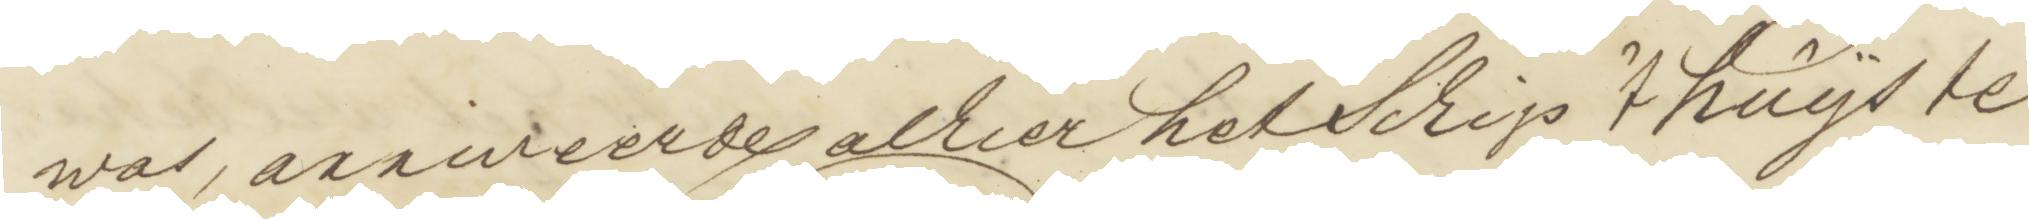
was, arriveerde alhier het schip 't huijs te
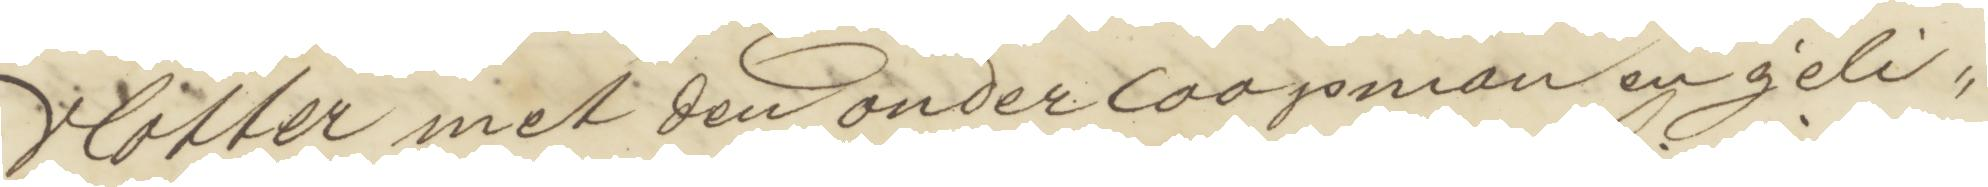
Vlotter met den onder coopman en g'eli„
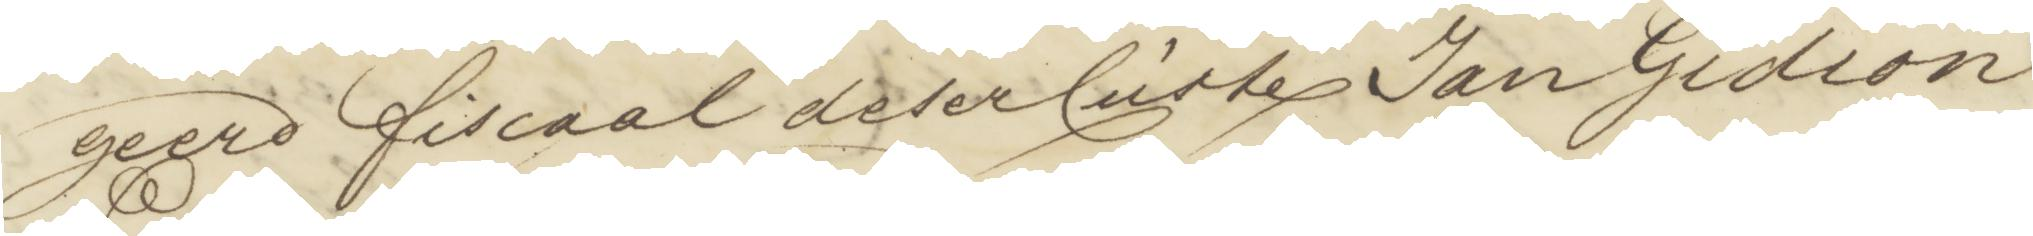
geerd fiscaal deser Custe Ian Gidion
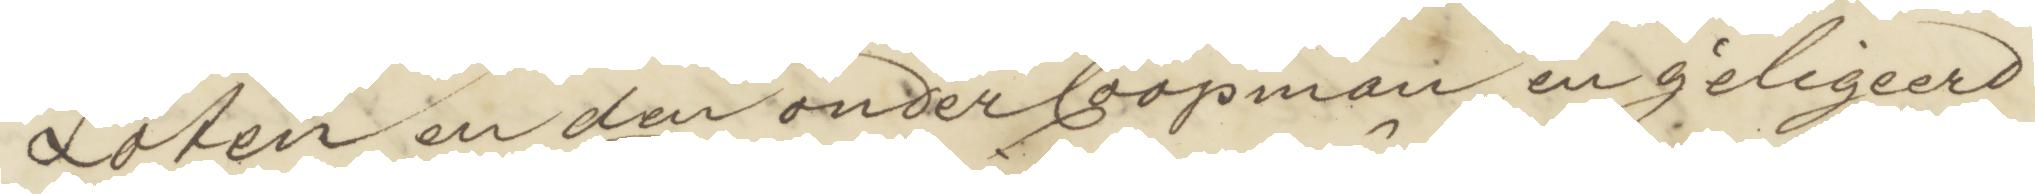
Loten en den onder Coopman en g'eligeerd
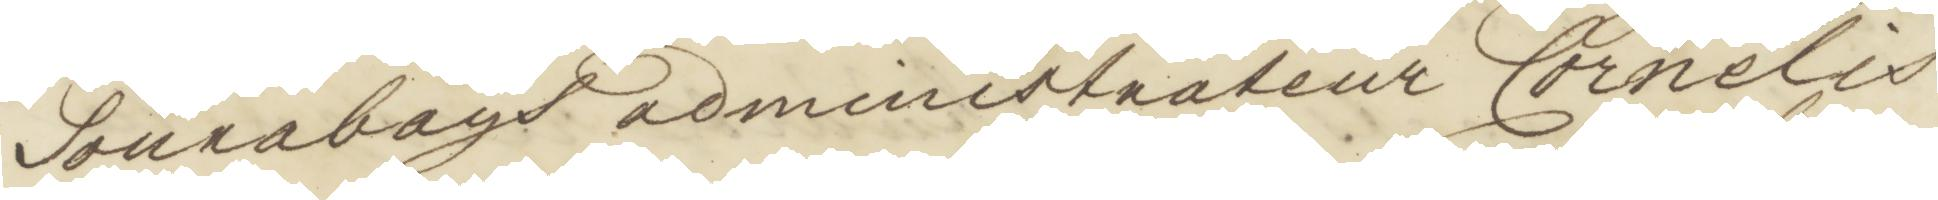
sourabaijs administrateur Cornelis
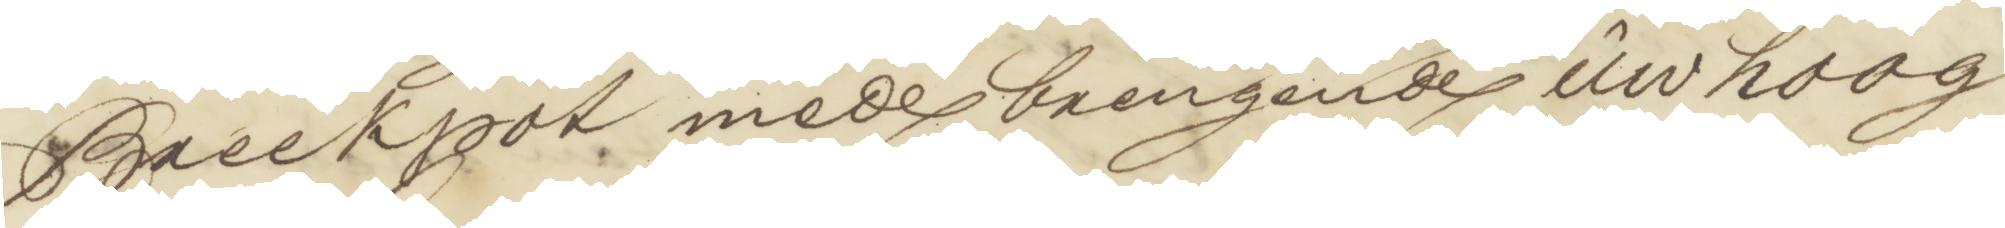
Breekpot mede brengende uw hoog
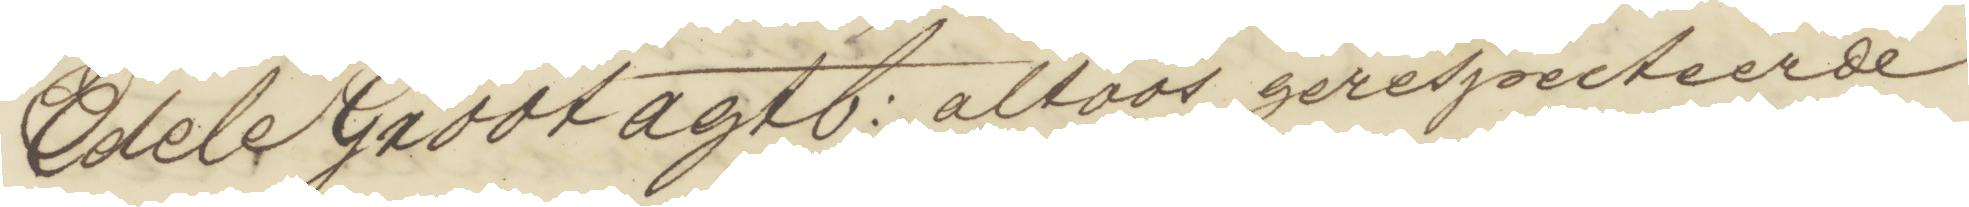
Edele Groot agtb: altoos gerespecteerde
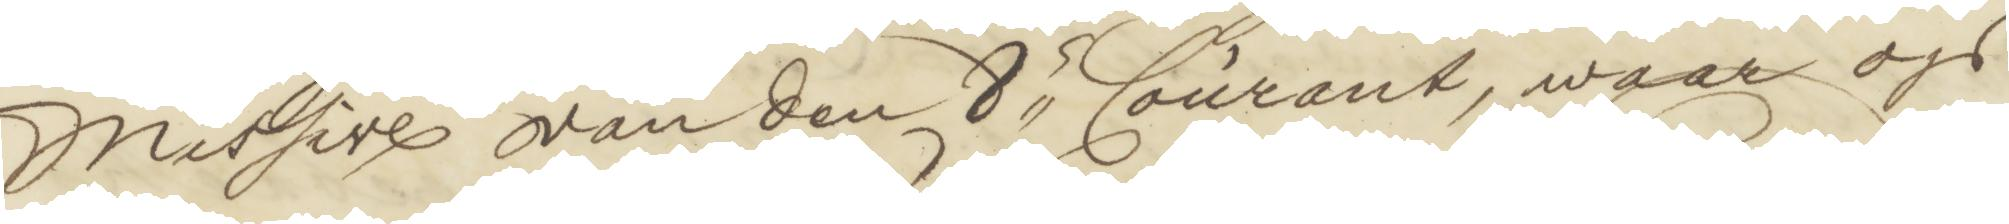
missive van den 8„' Courant, waar op
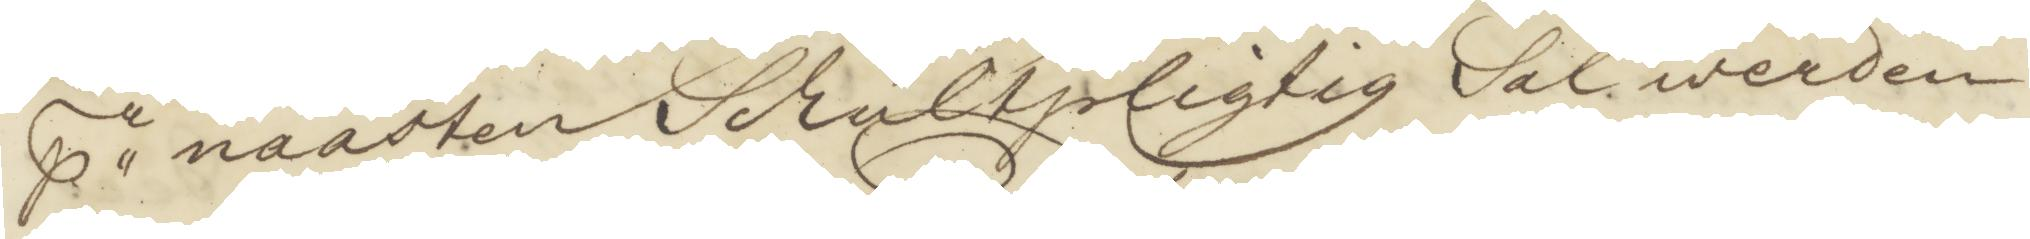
p„r naasten schultpligtig sal werden
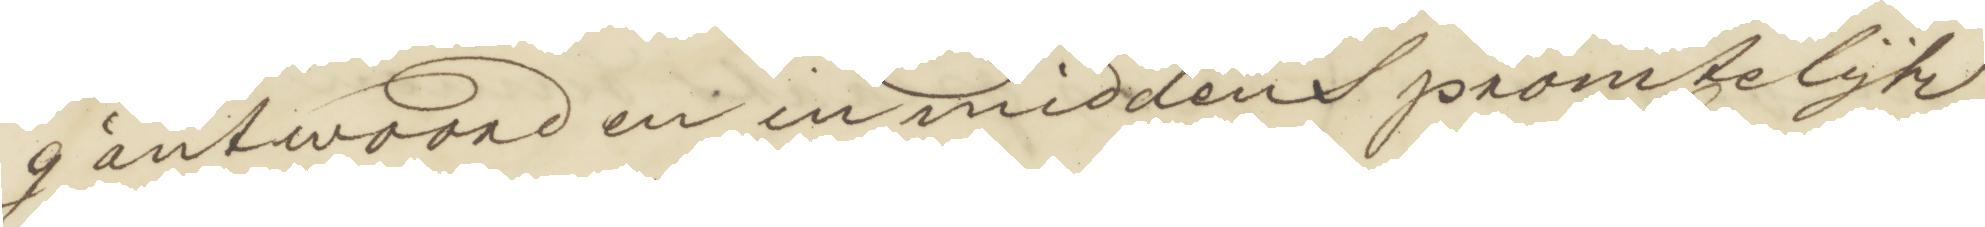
g'antwoord en in middens promtelijk
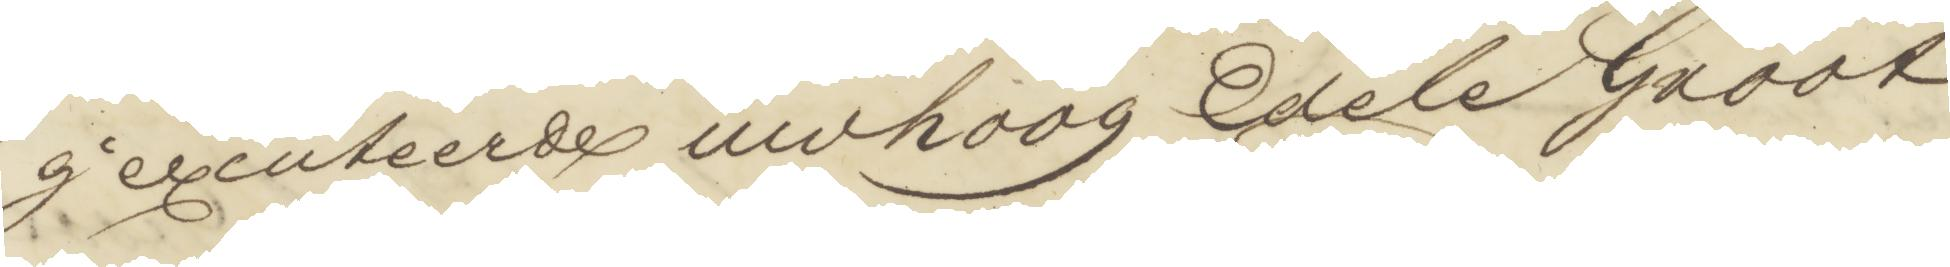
g'excuteerde uw hoog Edele Groot
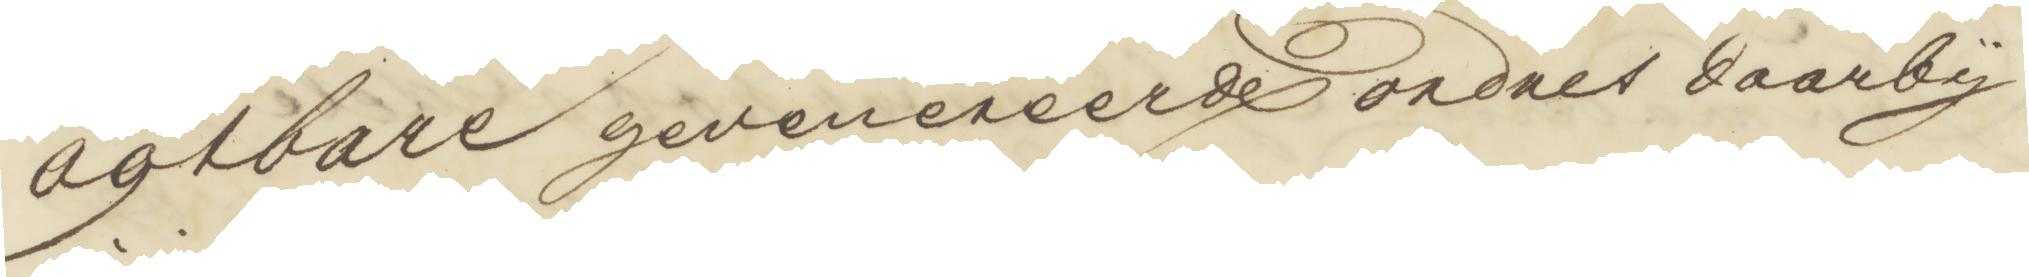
agtbare gevenereerde ordres daarbij
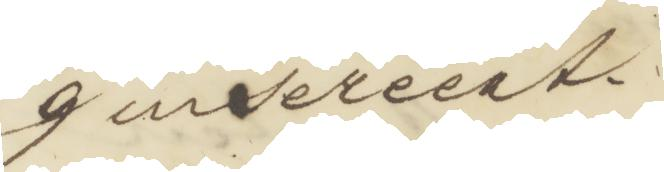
g'insereert.
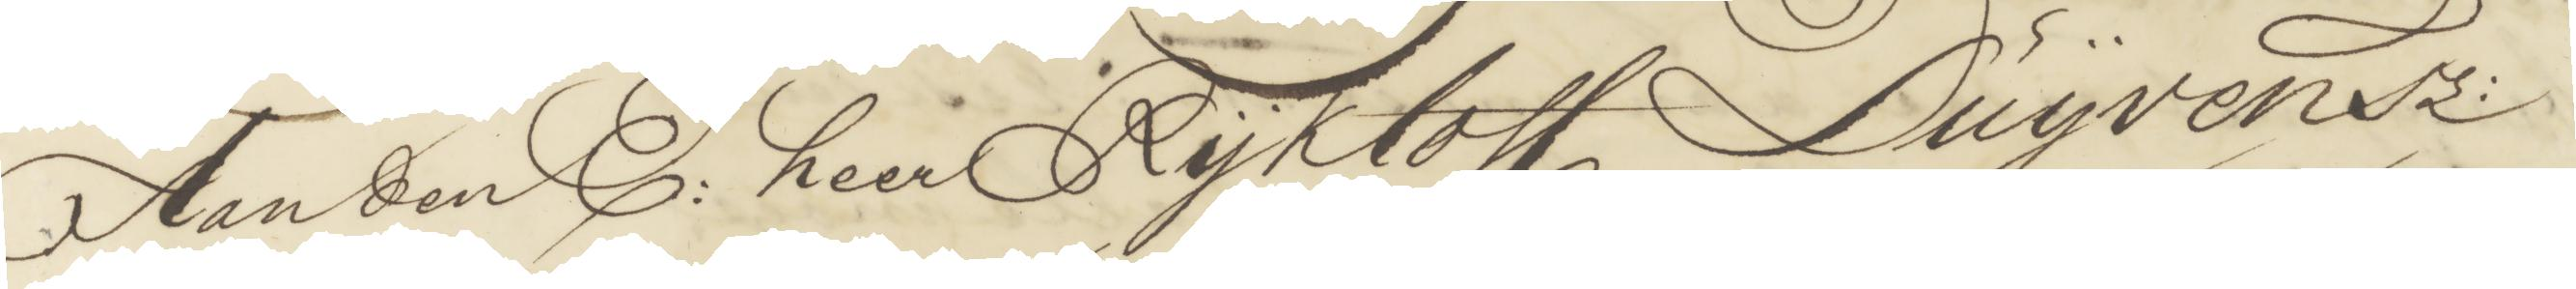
Aan den E: heer Rijkloff Duijvensz:
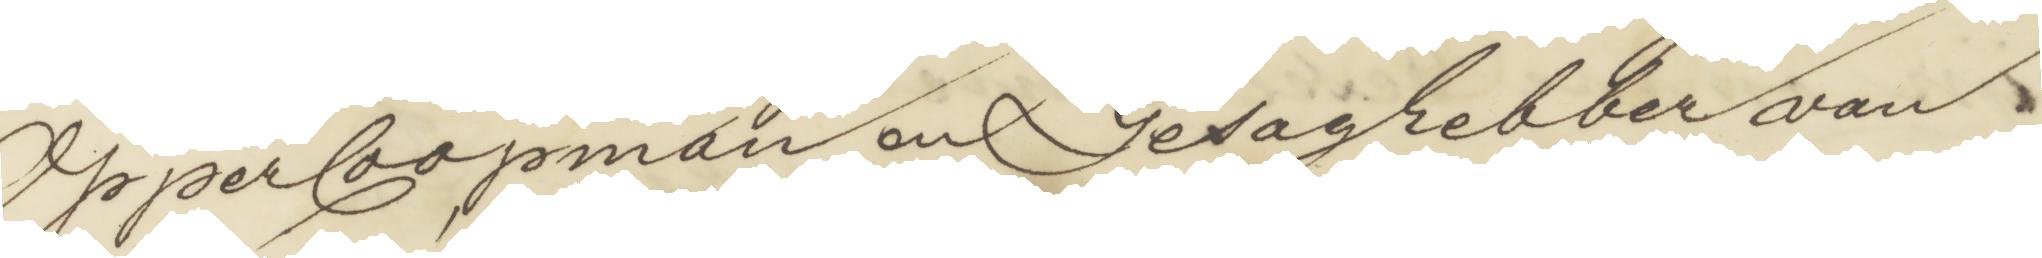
Opper Coopman en Gesaghebber van
